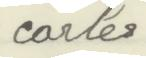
cartes
